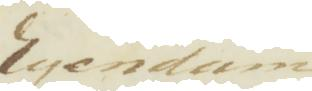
Egendam
